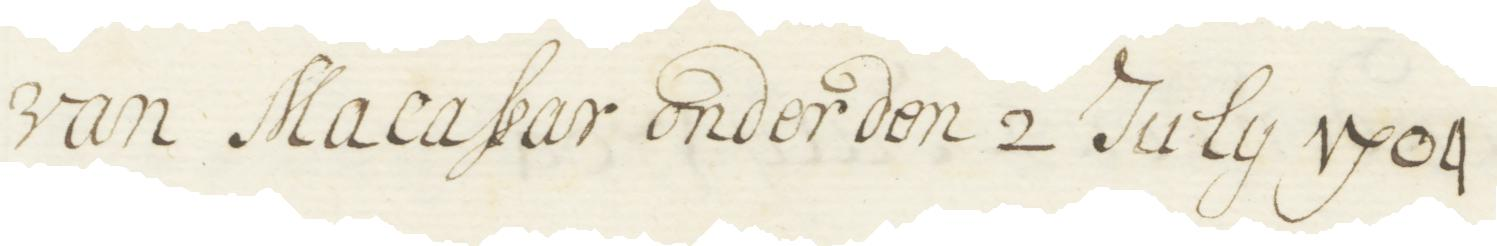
van Macassar onder den 2 July 1704
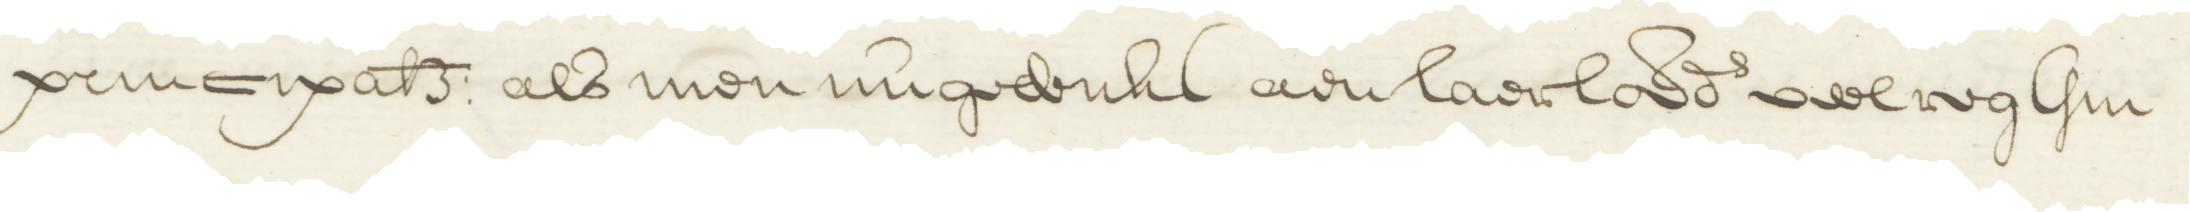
principalijk als men nu gebukt aen haerl:ds veel reg tsin
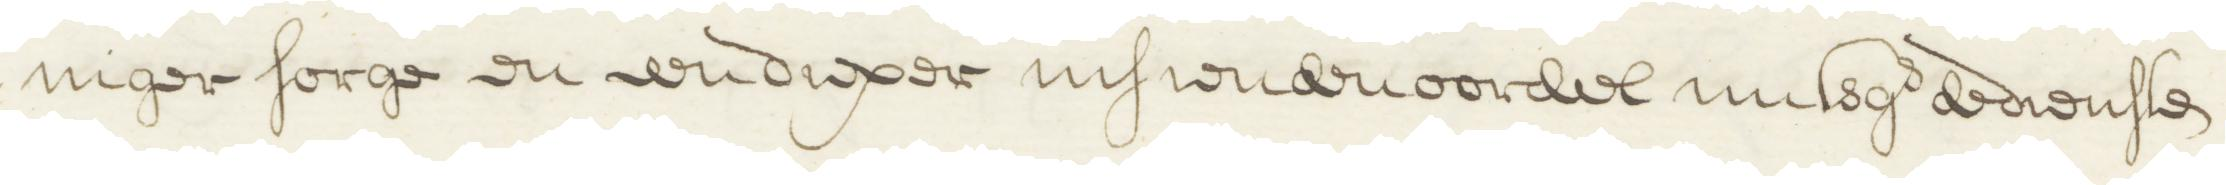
niger sorge en een dieper insienden oordeel mitsgs de diensten
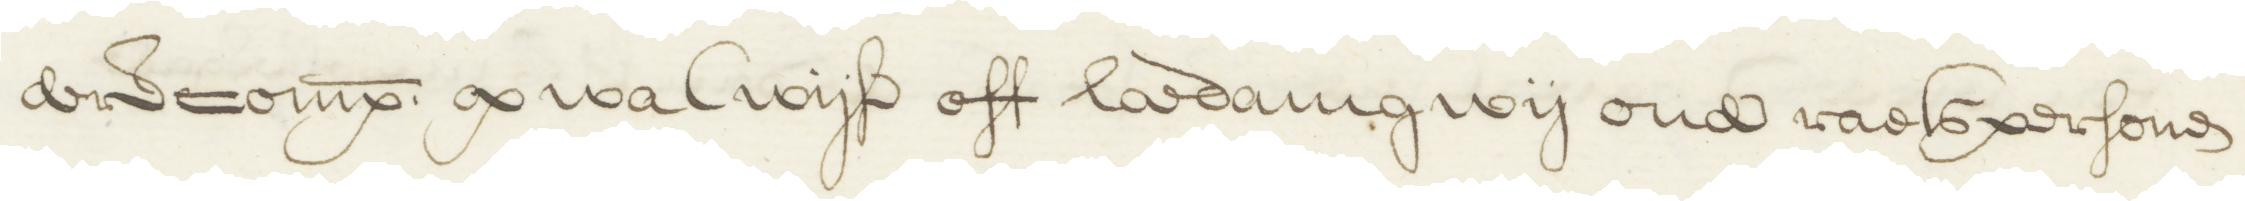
der E comp: op wat wijse off hoedanig wij oude raetspersonen
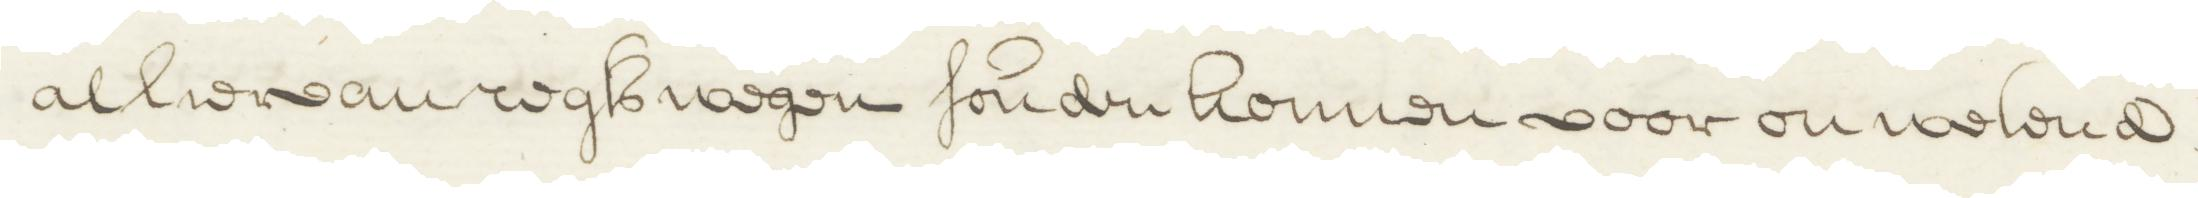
alhier van regts wegen souden konnen voor on wetende
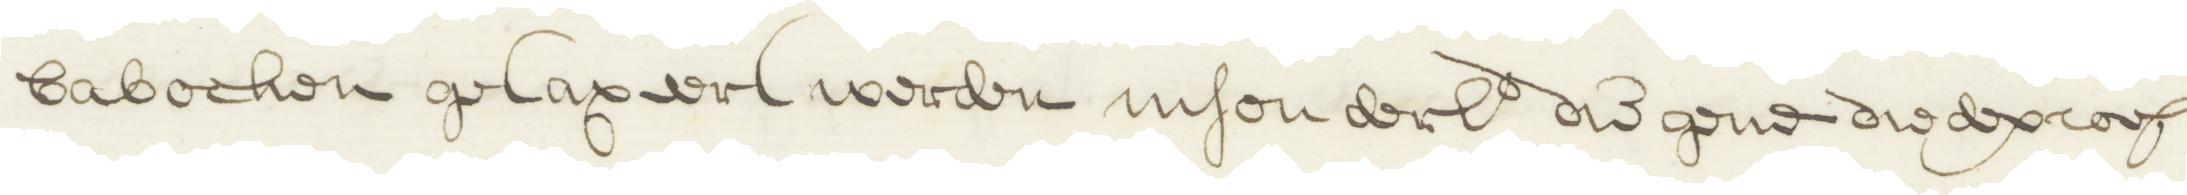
babocken getaxeert werden insonderhd die gene die de proef
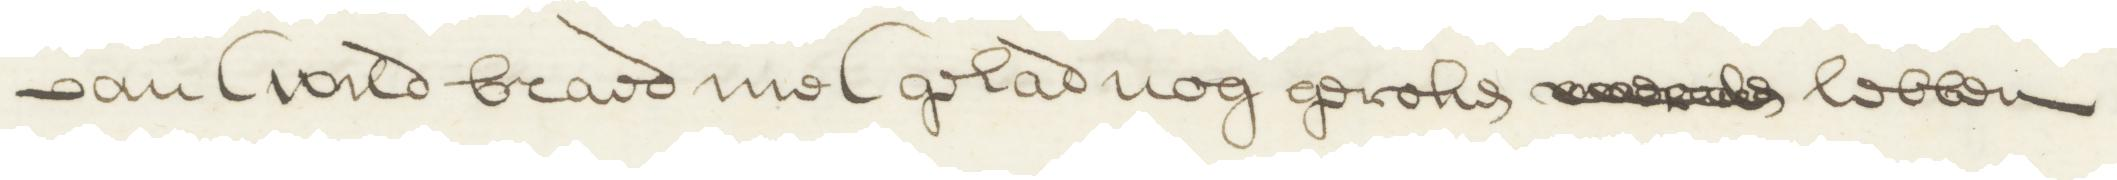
van t wild braed niet gehad nog geroken hebben
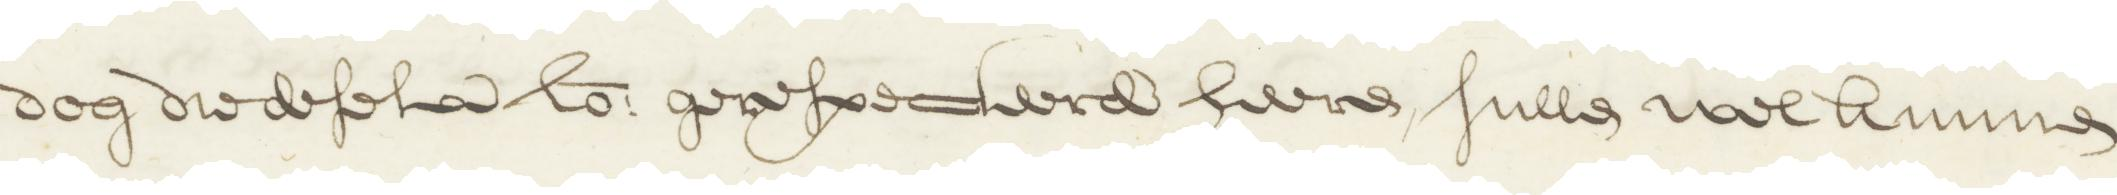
dog die deselve ho: gerespecteerde heeren, sullen wel kunnen
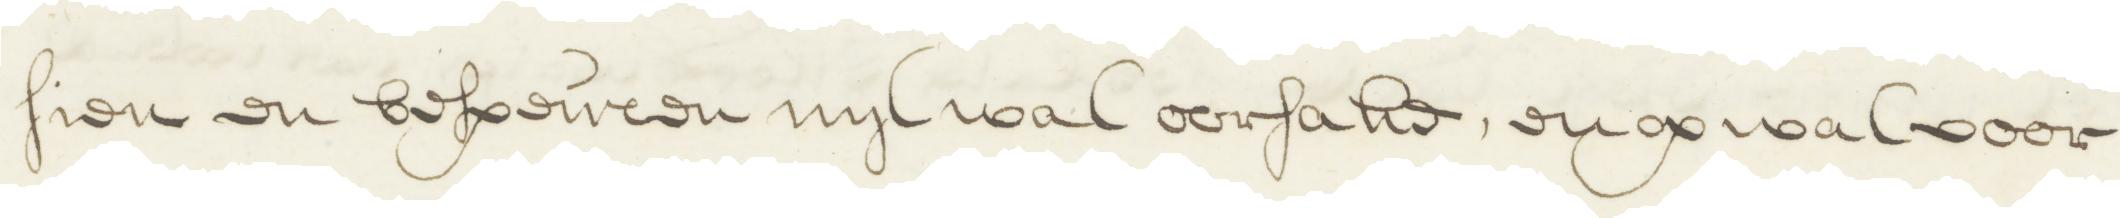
sien en bespeuren uyt wat oorsake, en op wat voor
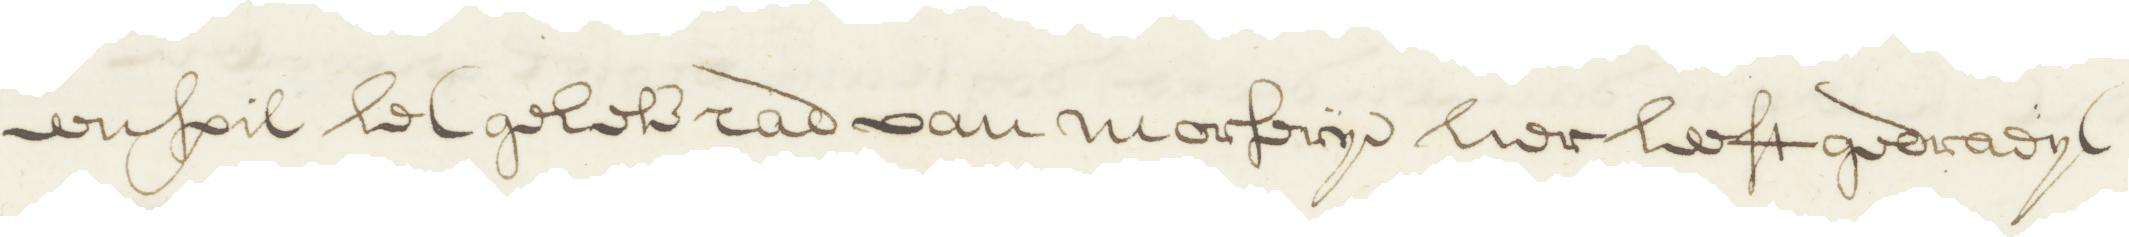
een spil het gehele rad van morserije hier heeft gedraeijt
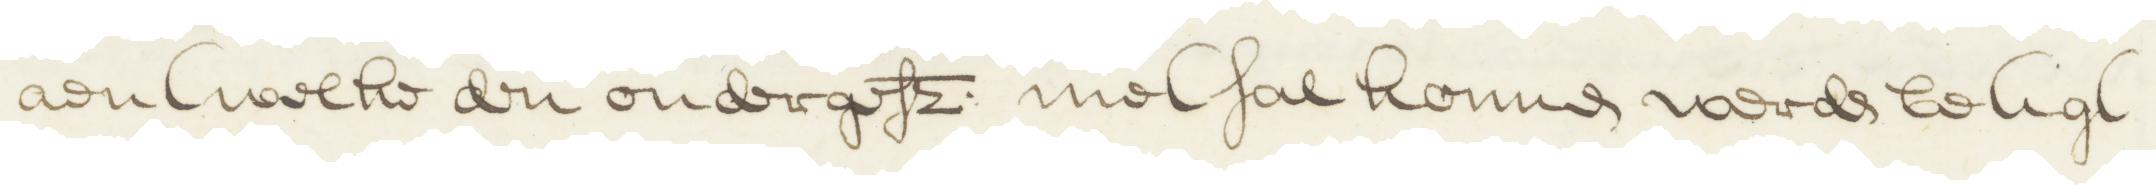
aen twelke den ondergesz: niet sal konnen werden betigt
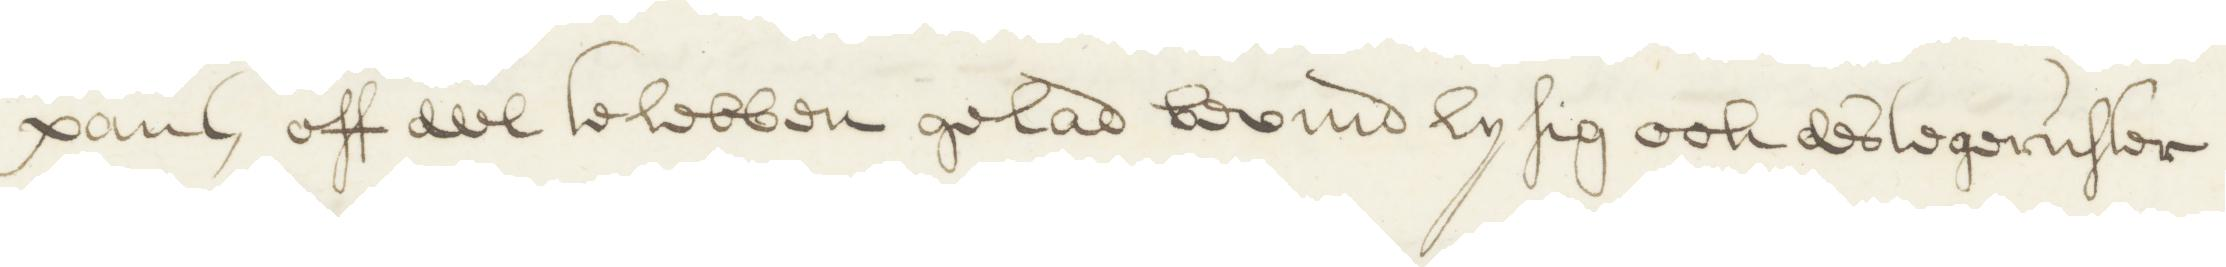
pant, off deel te hebben gehad bevind hy sig ook des te geruster
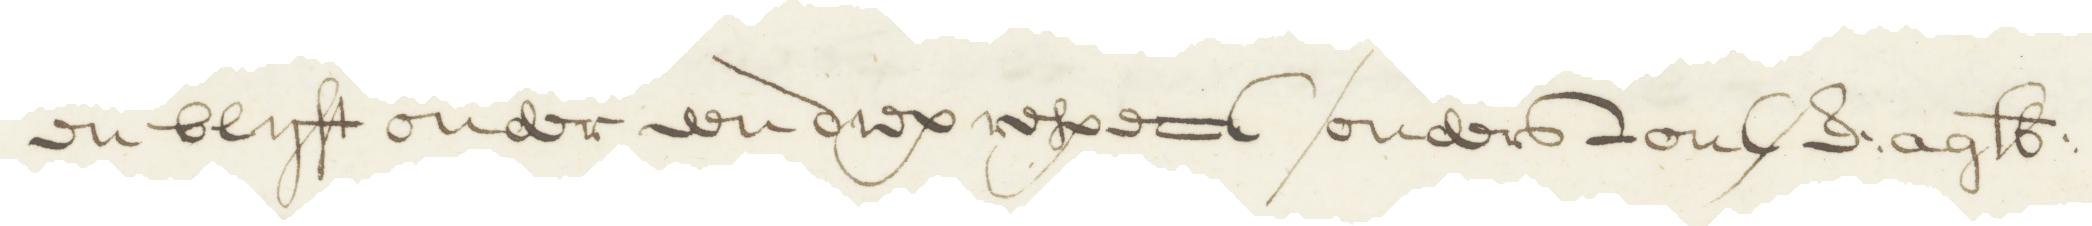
en blyft onder een diep respect /onderstont/ E: agtb:
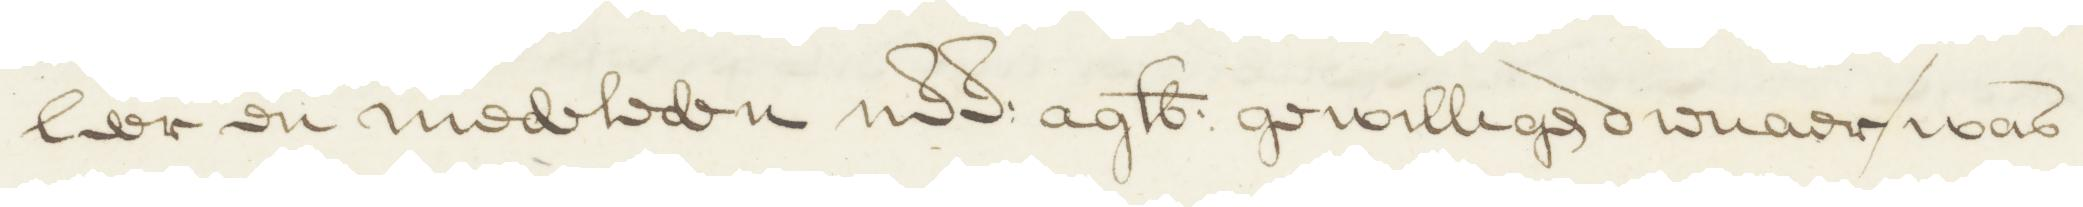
heer en medeleden uEE: agtb: gewilligen dienaer/ was
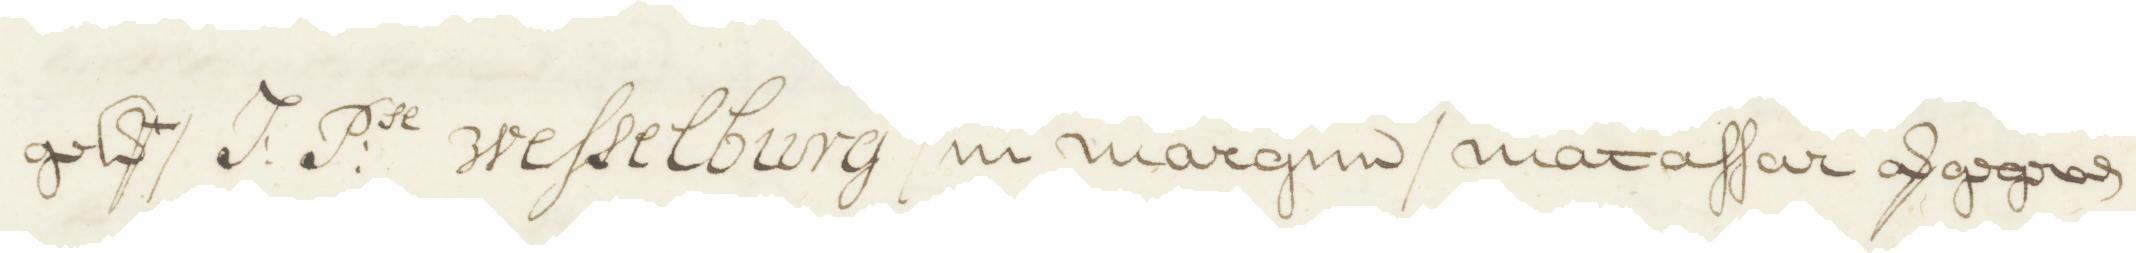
getkt/ I: P:se wesselburg in margine / macassar overgegeven
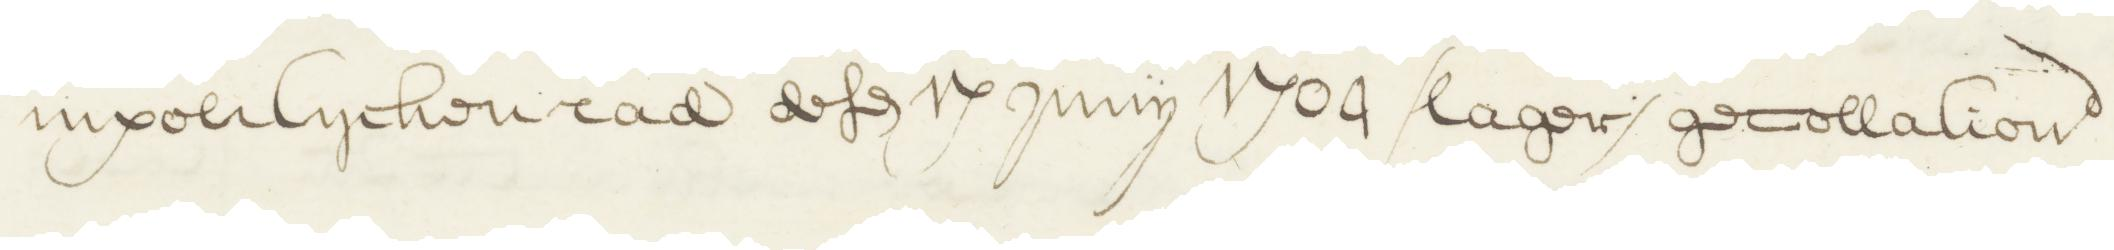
in politycken rade desen 17 junij 1704 /lager/ gecollationd
